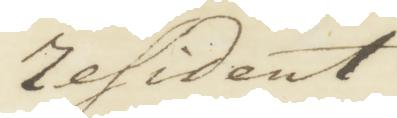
resident
